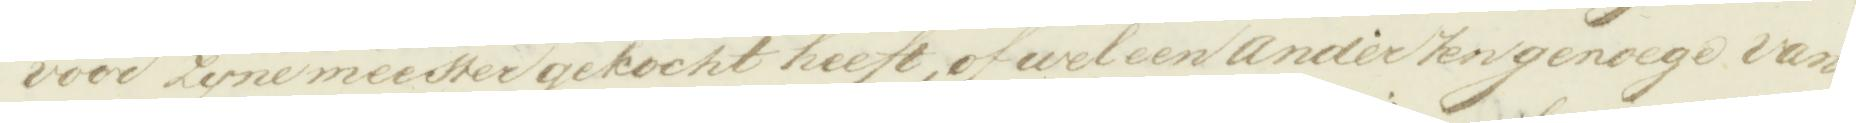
voor zyne meester gekocht heeft, of wel een ander ten genoege van
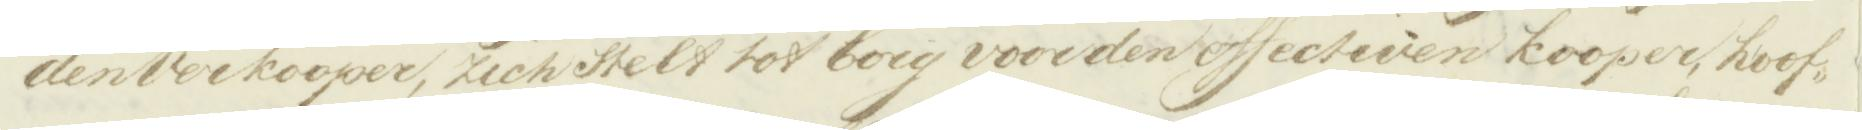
den verkooper, zich stelt tot borg voor den effectiven kooper, hoof„
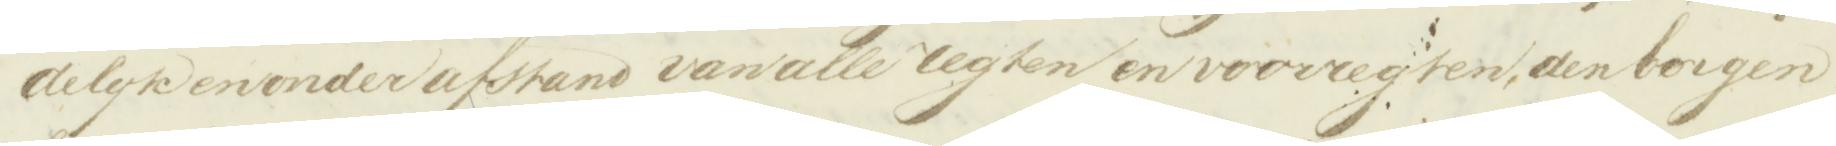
delyk en onder afstand van alle regten en voorregten, den borgen
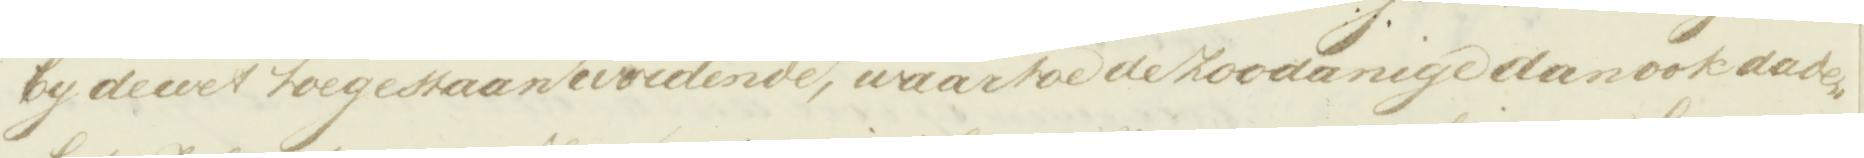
by de wet toegestaan wordende, waartoe de zoodanige dan ook dade
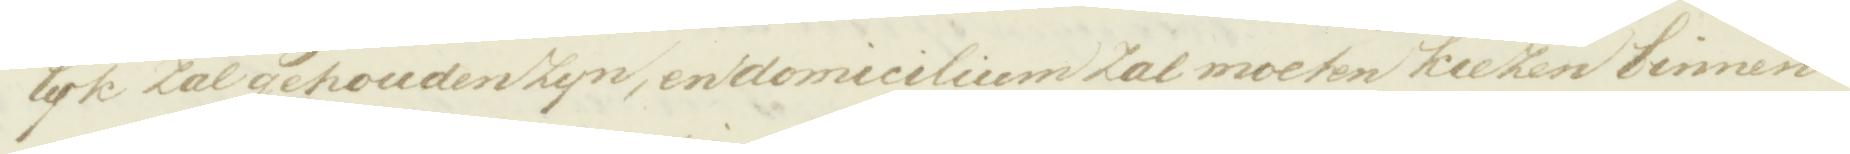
lyk zal gehouden zyn, en domicilium zal moeten kiezen binnen
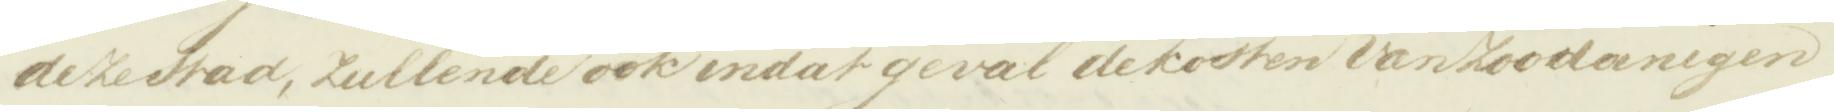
deze stad, zullende ook in dat geval de kosten van zoodanigen
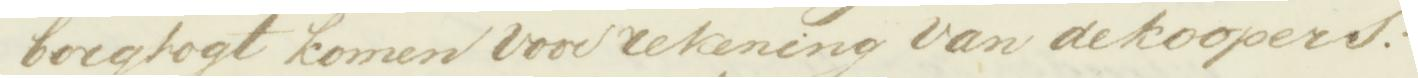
borgtogt komen voor rekening van de koopers.
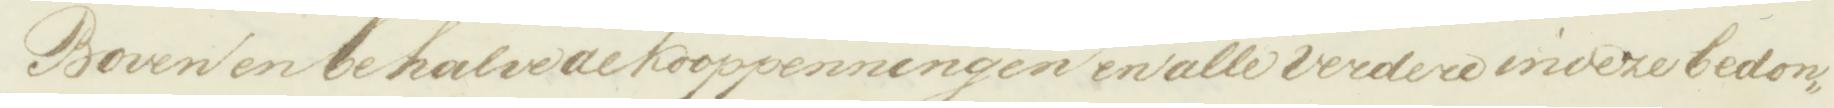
Boven en behalve de kooppenningen en alle verdere in deze bedon„
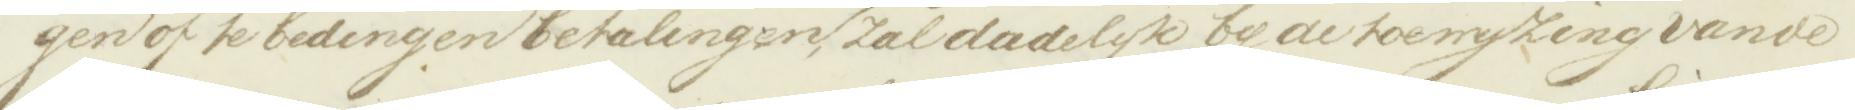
gen of te bedingen betalingen, zal dadelyk by de toewyzing van de
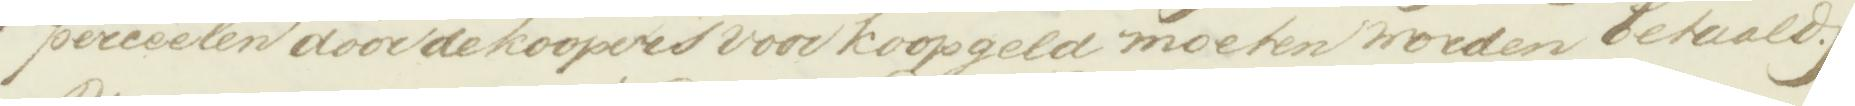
perceelen door de koopers voor koopgeld moeten worden betaald.
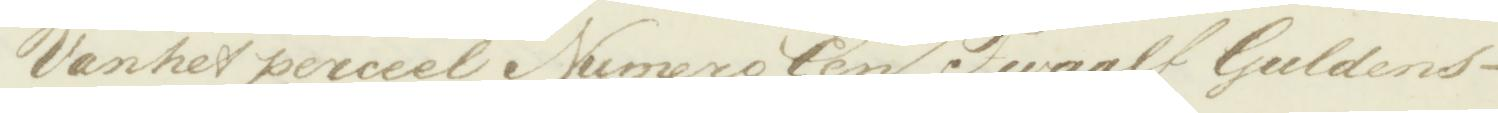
van het perceel Numero Een Twaalf Guldens-
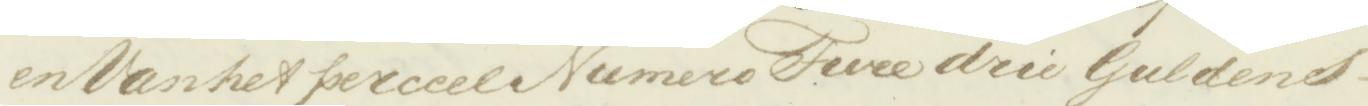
en van het perceel Numero Twee drie Guldens
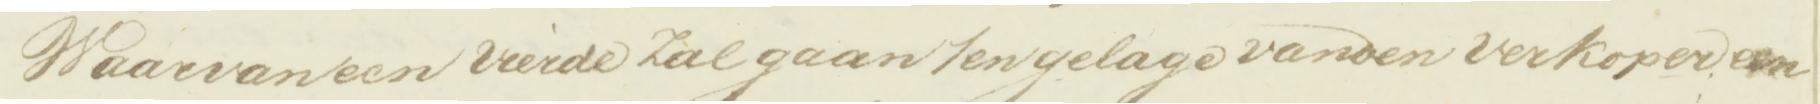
Waarvan een vierde zal gaan ten gelage vanden verkoper een
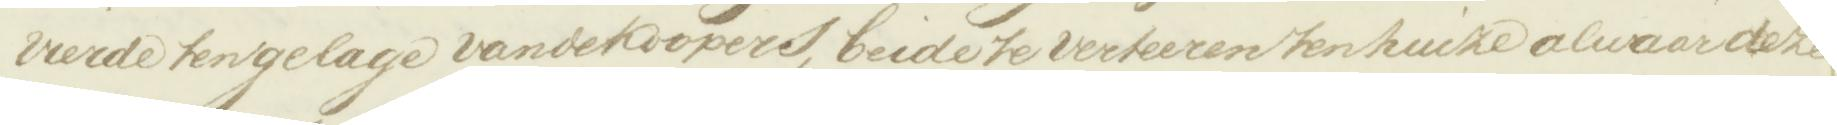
vierde ten gelage vande koopers, beide te verteeren ten huize alwaar deze
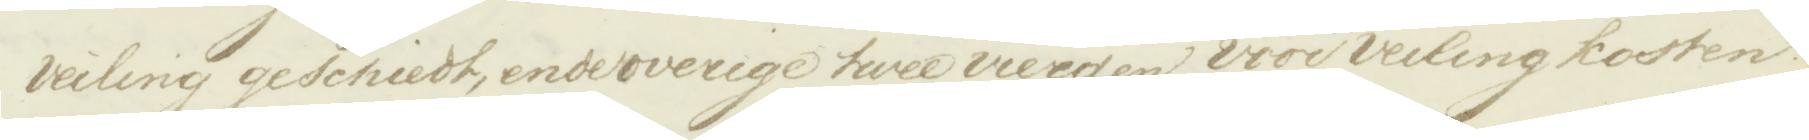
veiling geschiedt, en de overige twee vierden voor veiling kosten.
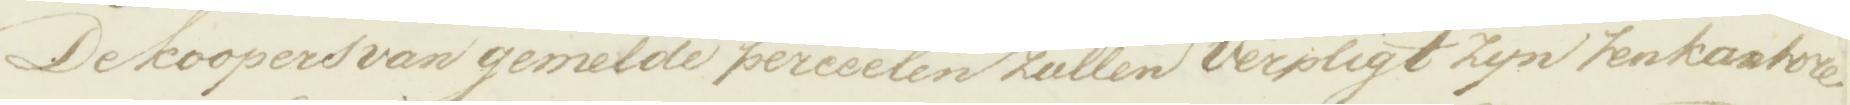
De koopers van gemelde perceelen zullen verpligt zyn ten kantore
